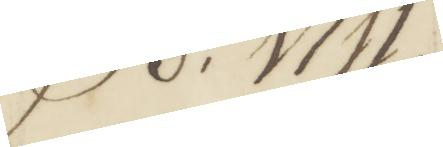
A:o 1711.
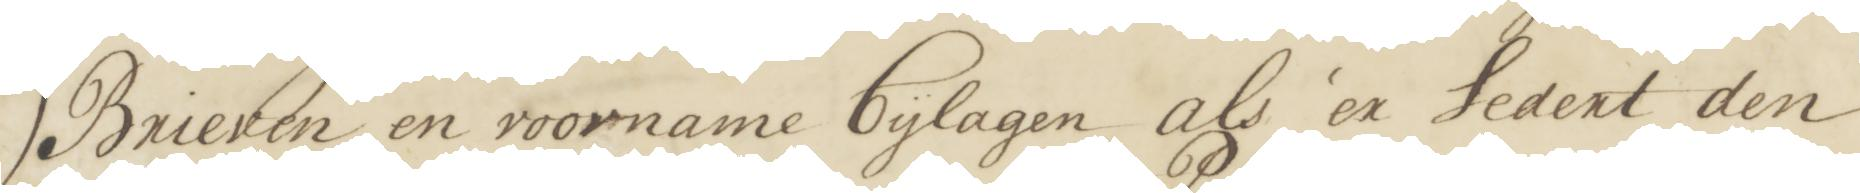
Brieven en voorname bijlagen als 'er sedert den
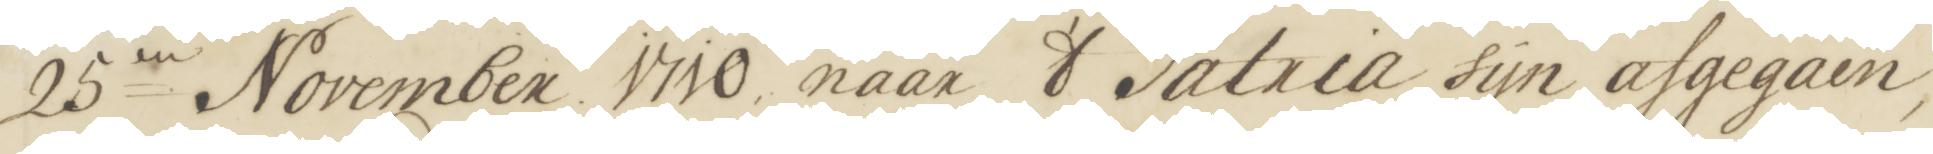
25=en November. 1710, naar ’t Patria sijn afgegaen,
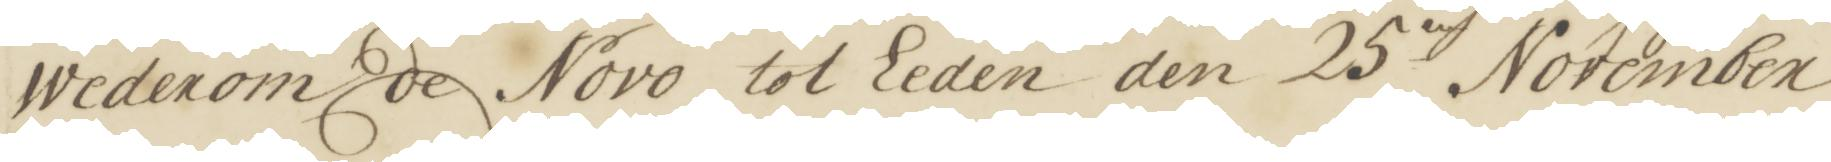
wederom de Novo tot heden den 25=en November
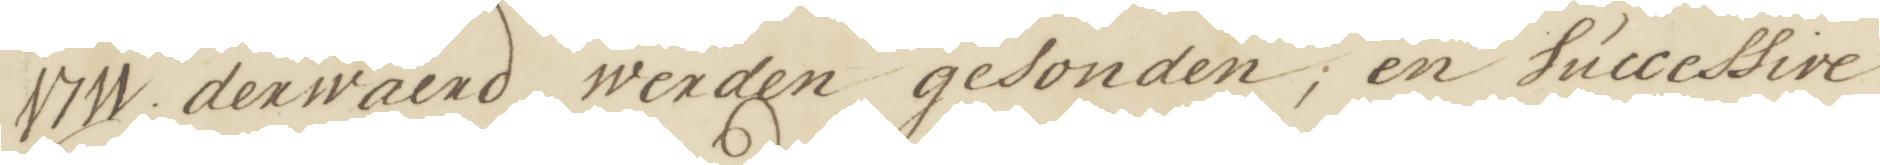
1711. derwaerd werden gesonden; en successive
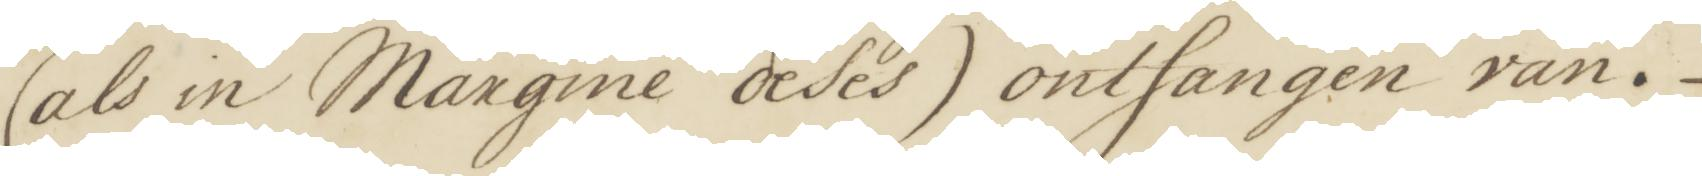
(als in Margine deses) ontfangen van. —
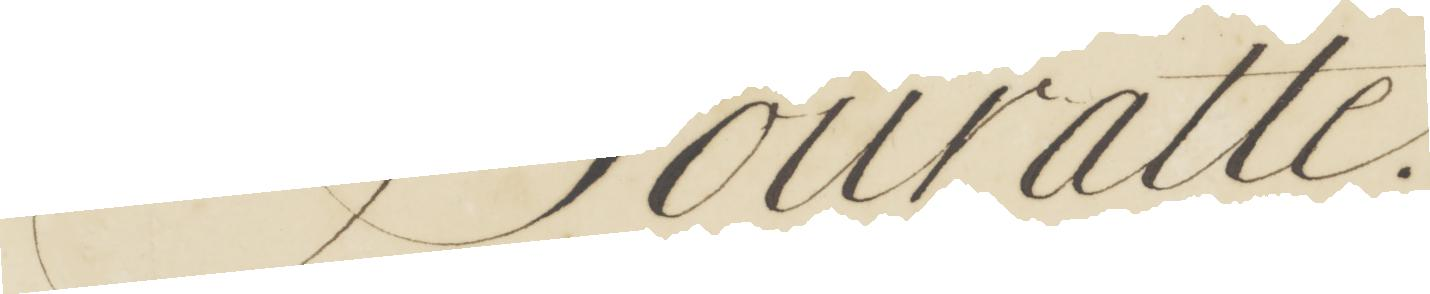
Souratte.
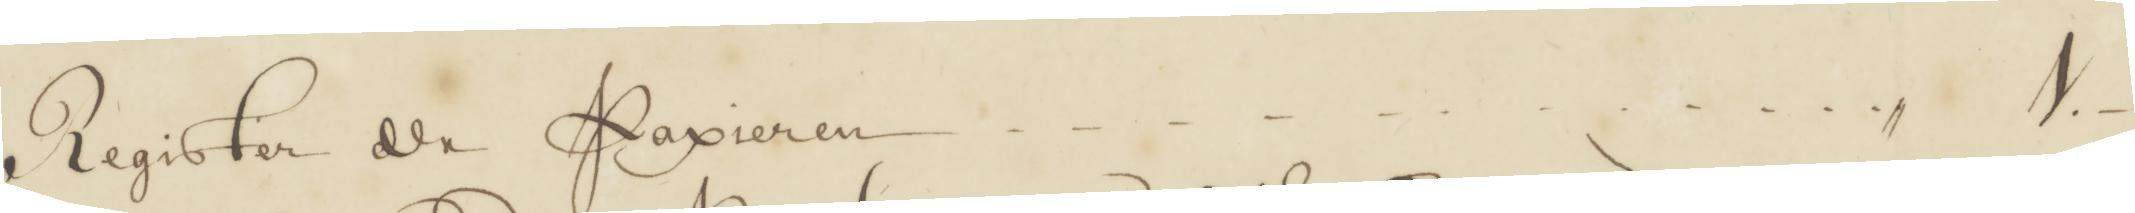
Register der Papieren - - - - - - - - - - - - „ 1. —
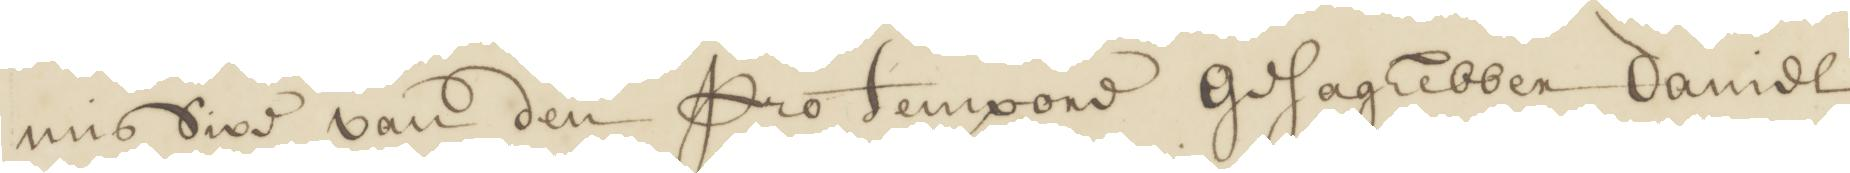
missive van den Pro tempore gesaghebber Daniel
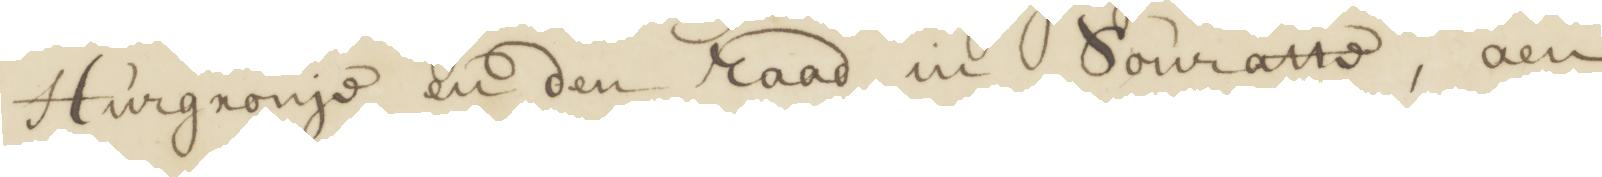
Hurgronje en den Raad in Souratte, aen
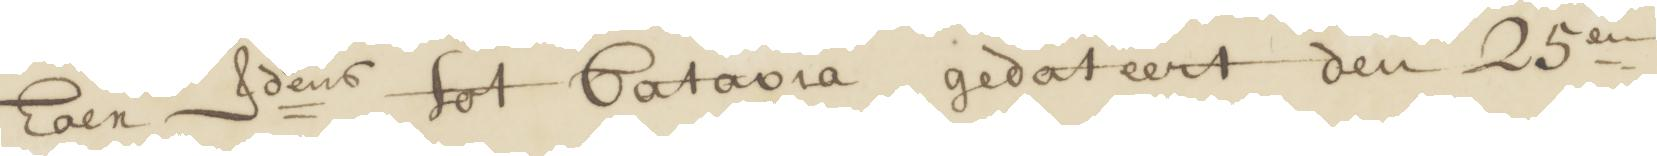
haer E=dens tot batavia gedateert den 25=en
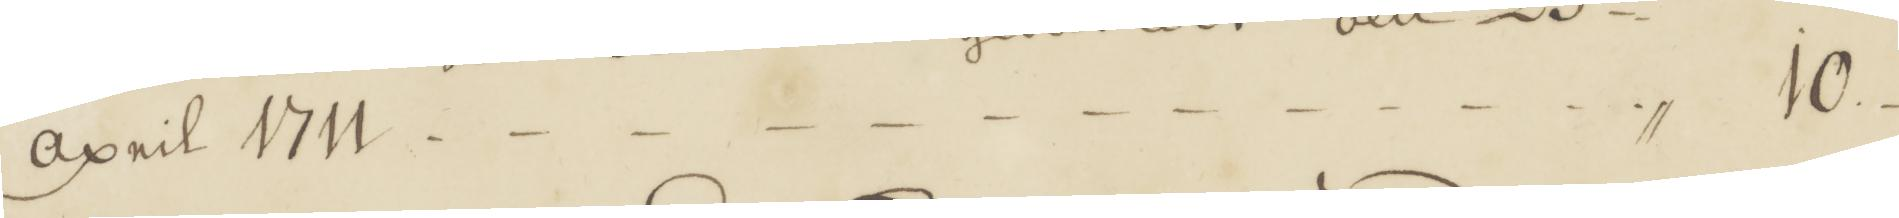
April 1711 - - - - - - - - - - - - - „ 10. —
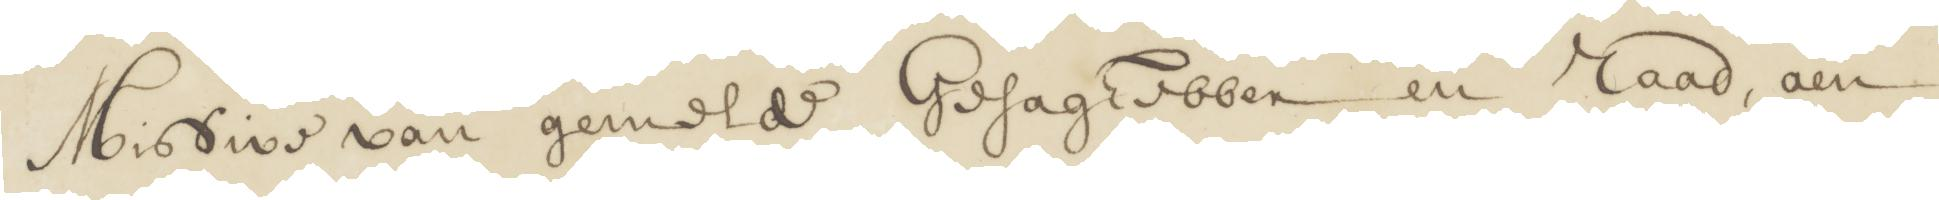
Missive van gemelde Gesaghebber en Raad, aen
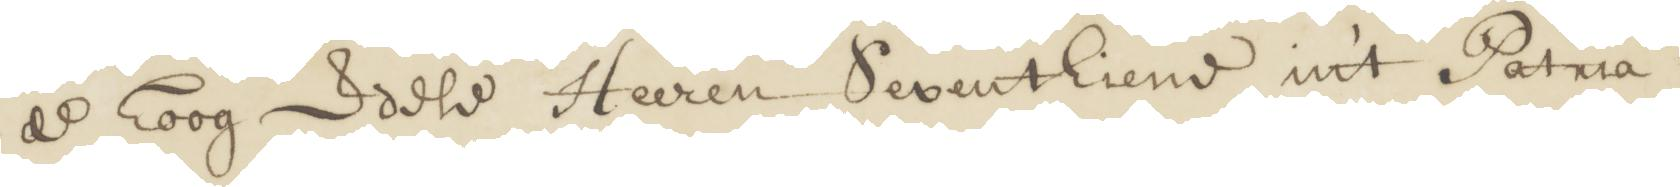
de hoog Edele Heeren Seventhiene in’t Patria
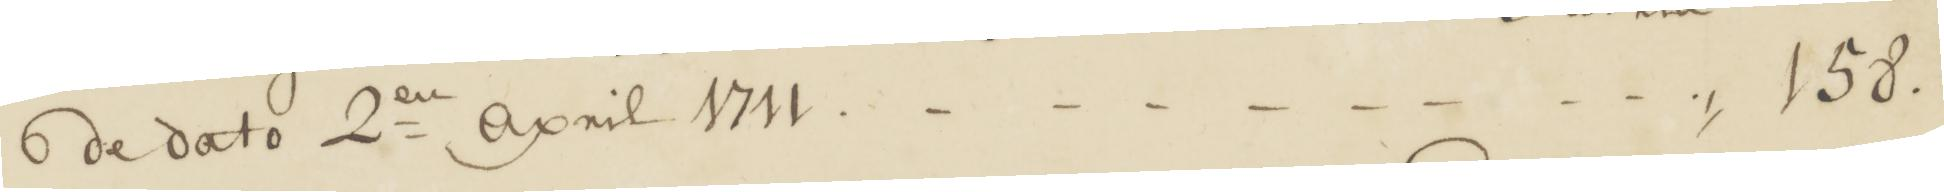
de dato 2=en April 1711. - - - - - - - - . „ 158.
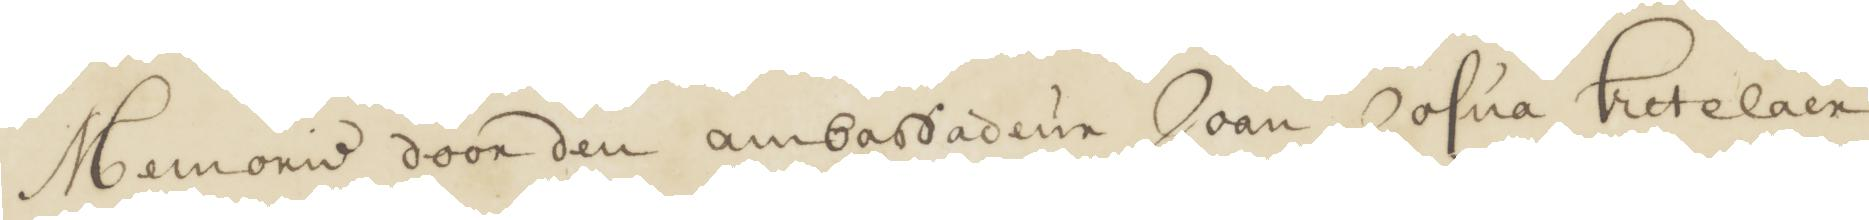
Memorie door den ambassadeur Joan Josua ketelaer
